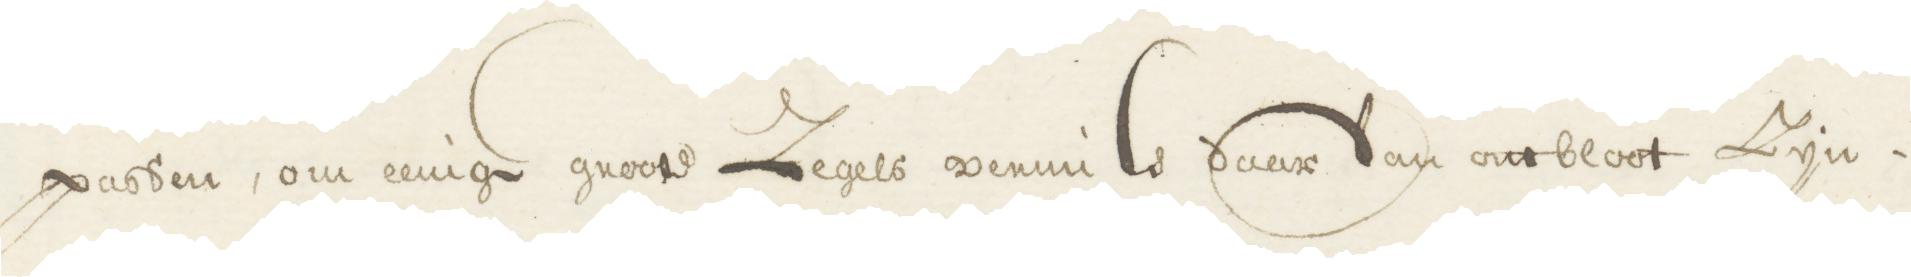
passen, om eenige groote Zegels vermits daar van ontbloot zijn.
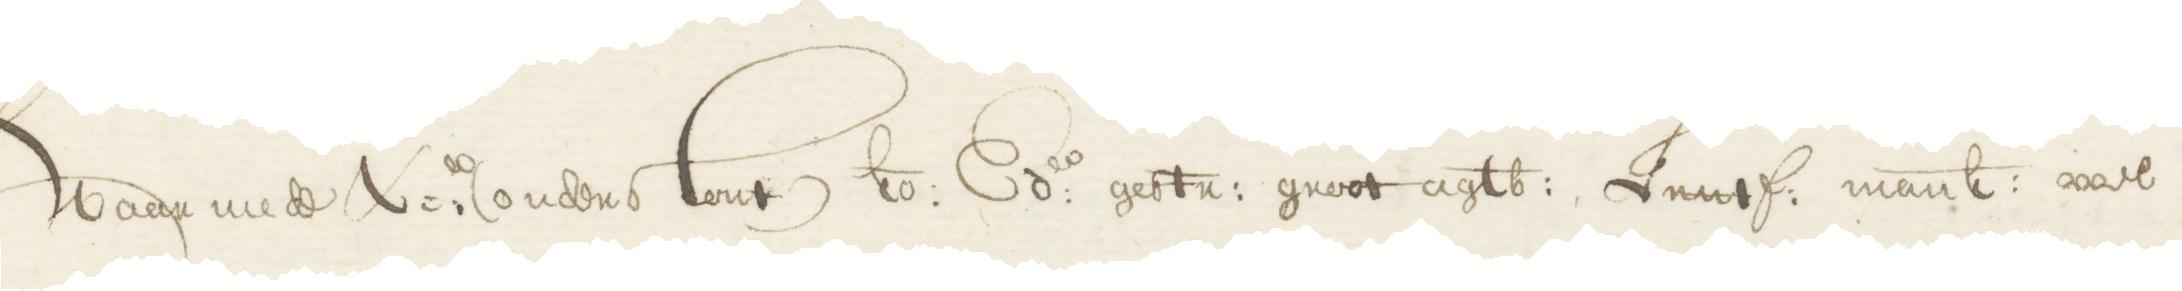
Waar mede &:a (onderstont) ho: Ed:le gestr: groot agtb: Erntf: manh: wel
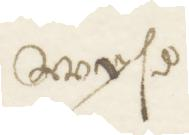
wyse
